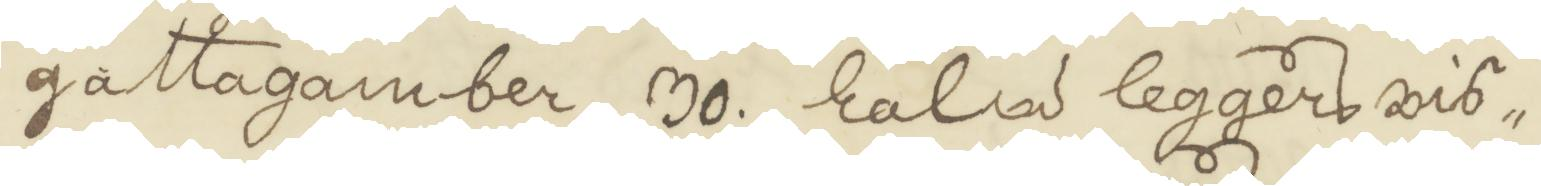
gattagamber, 30. halve leggers vis„
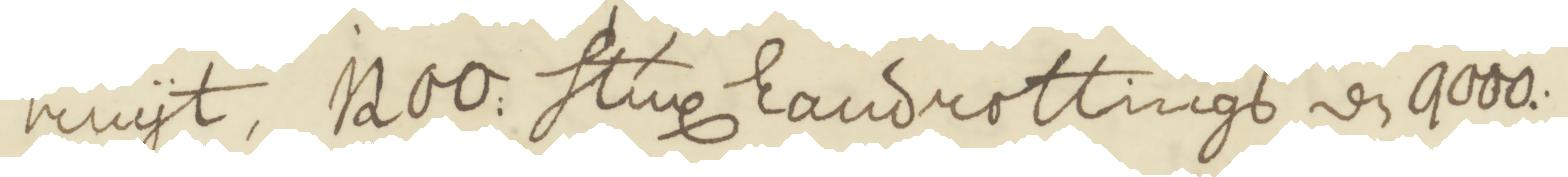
kuijt, 1200: stux handrottings en 4000:
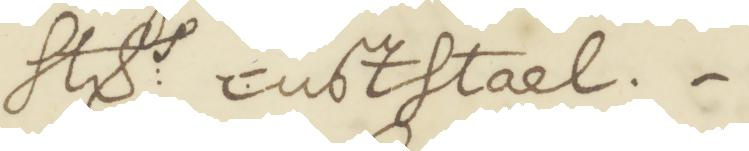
stver:s custstael. —
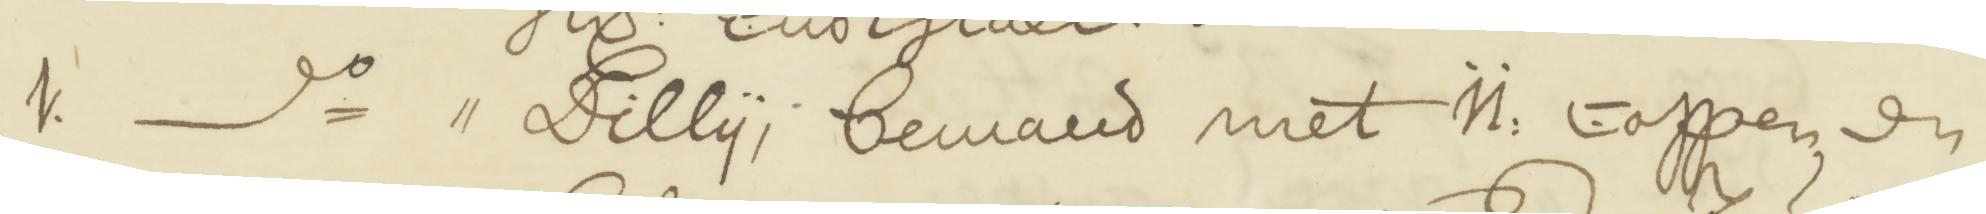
1. _=o „ Dillij, bemand met 11: Coppen en
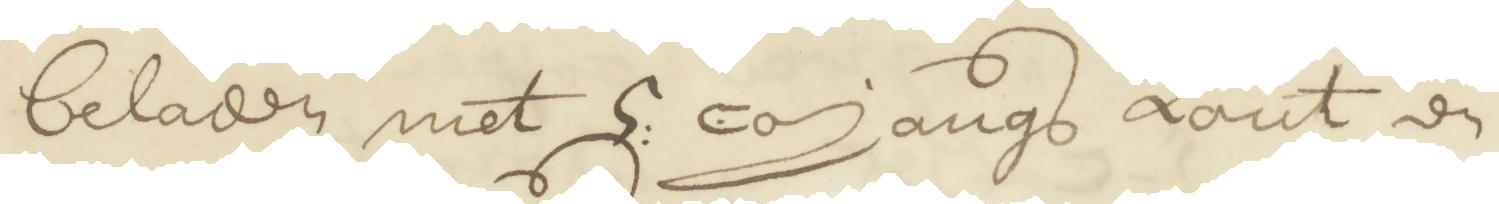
beladen met 5: cojangs zout en
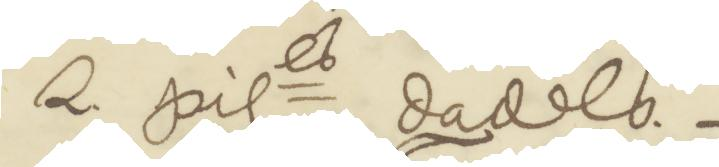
2. pic=ls dadels.
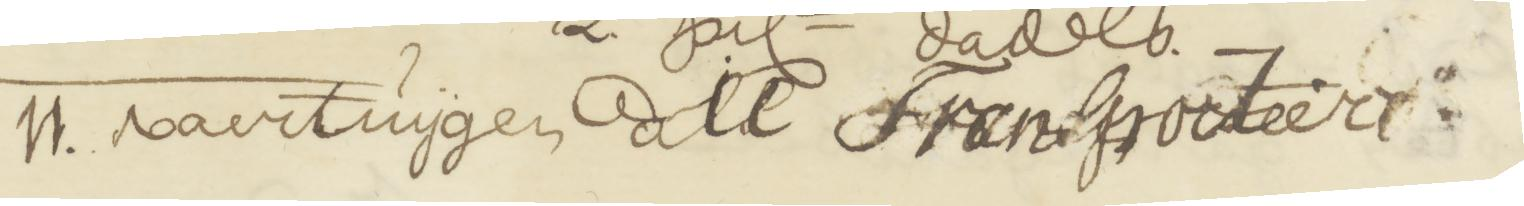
11. vaertuijgen die Transporteer
